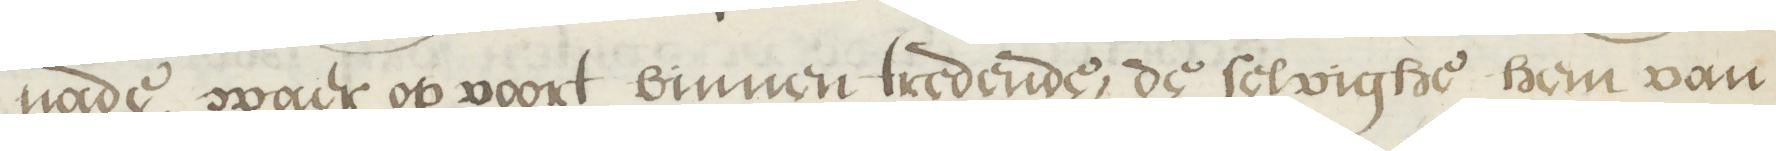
nade, waer op voort binnen tredende, de selvighe hem van
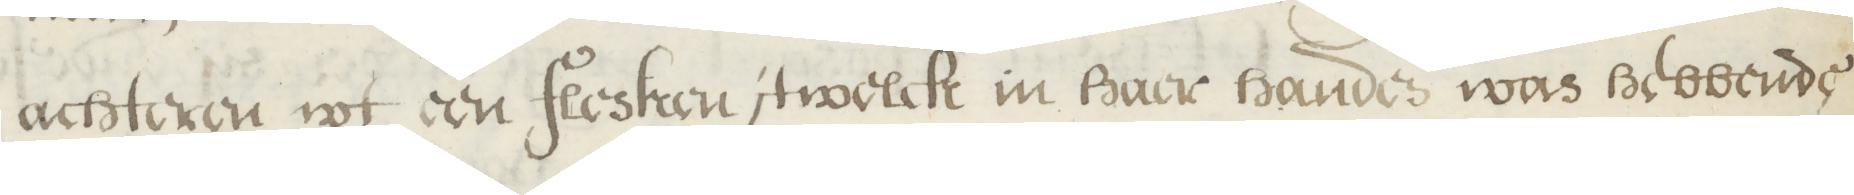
achteren wt een flesken, 'twelck in haer handen was hebbende
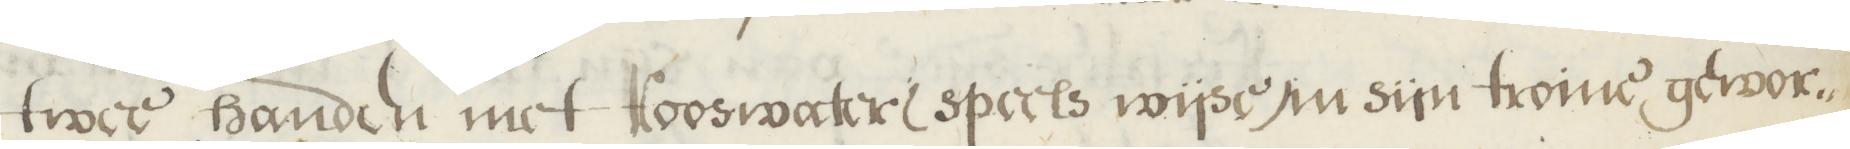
twee handen met Rooswater ( speels wijse ) in sijn troine gewor„
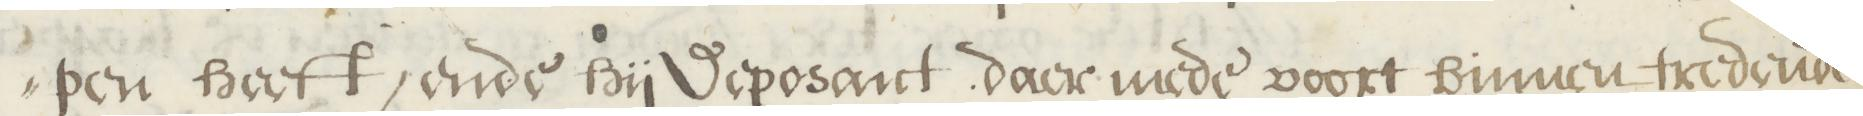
„pen heeft, ende hij Deposant daer mede voort binnen tredende,
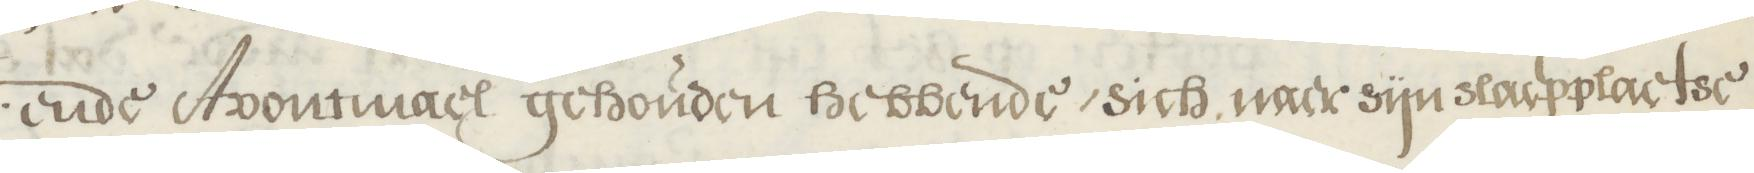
ende Avontmael gehouden hebbende, sich naer sijn slaepplaetse
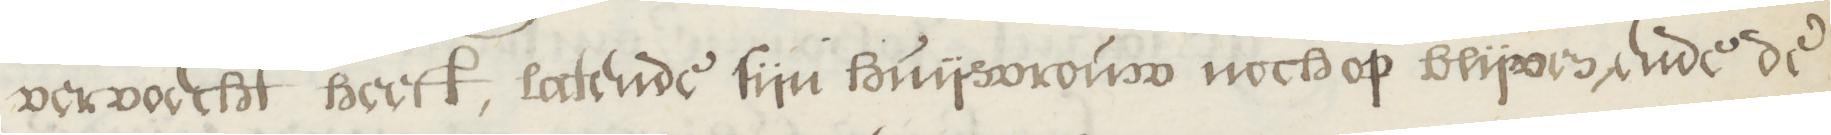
vervoecht heeft, latende sijn huijsvrouw noch op blijven, ende de
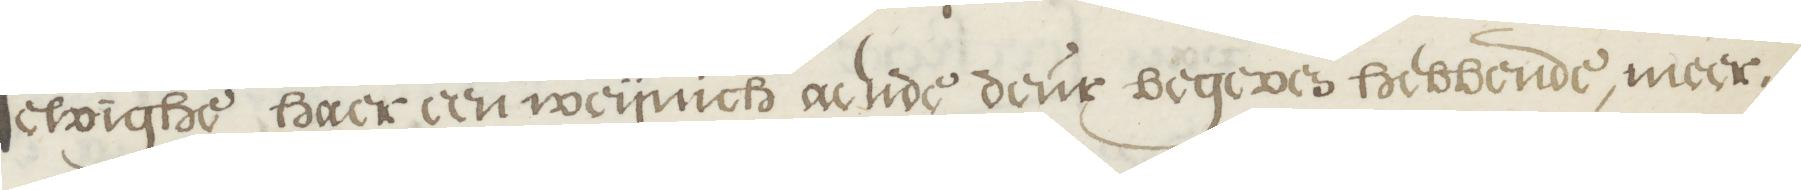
selvighe haer een weijnich aende deur begeven hebbende, meer„
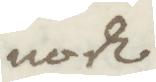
noch
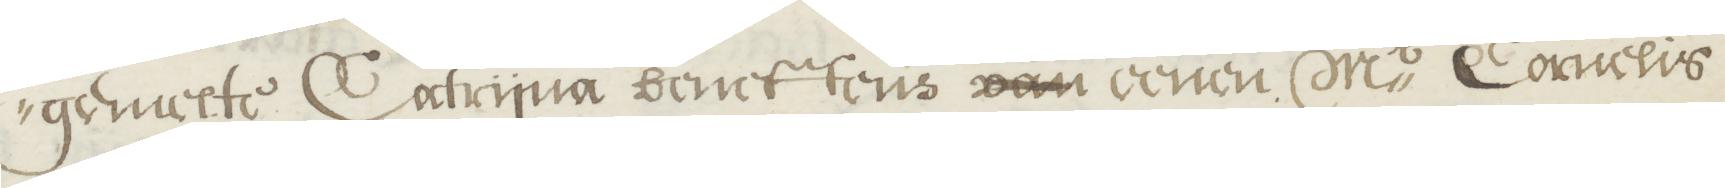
„gemelte Catrijna beneffens van eenen M„r Cornelis
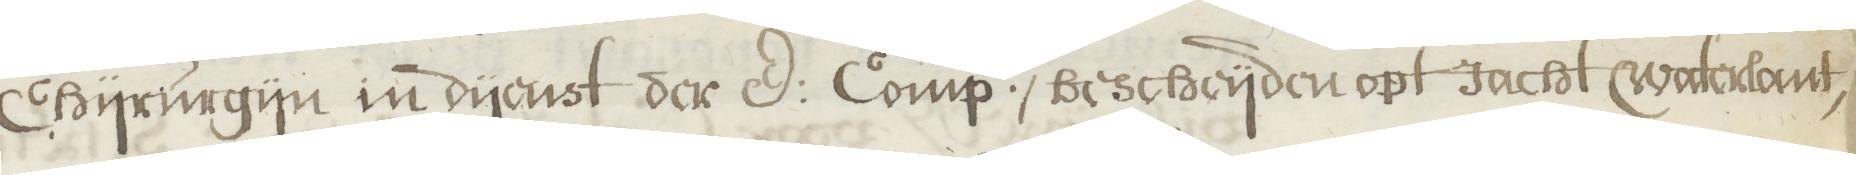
Chijrurgijn in dijenst der E: Comp.e / bescheijden opt Iacht waterlant,
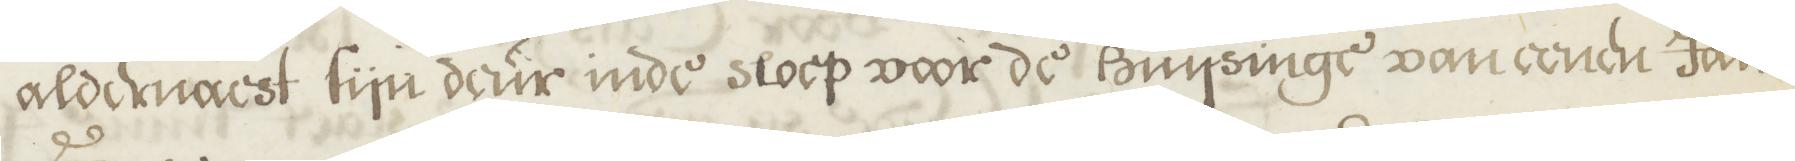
aldernaest sijn deur inde sloep voor de huijsinge van eenen Ian
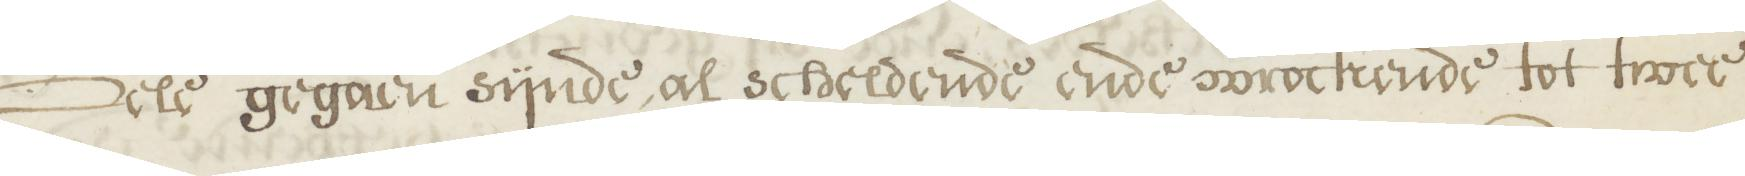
Gele gegaen sijnde, al scheldende ende wrockende tot twee
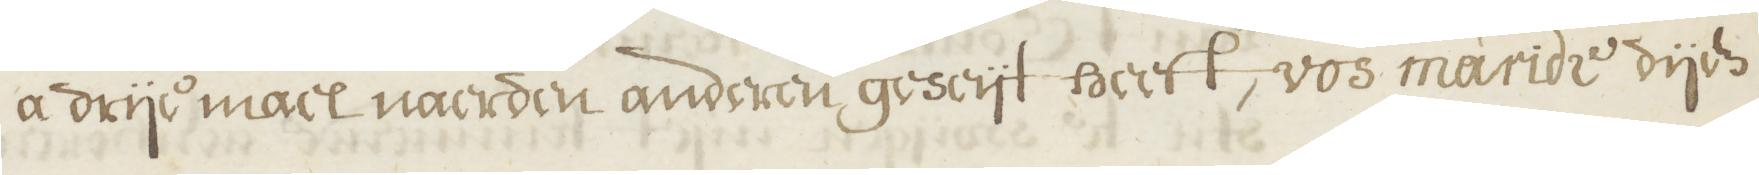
a drije mael naerden anderen geseijt heeft, vos maride dijen
